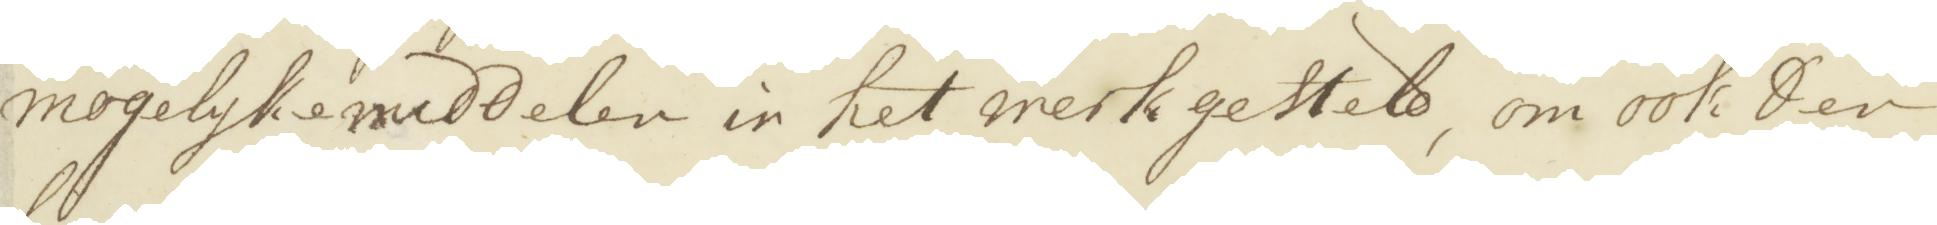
mogelyke middelen in het werk gesteld, om ook den
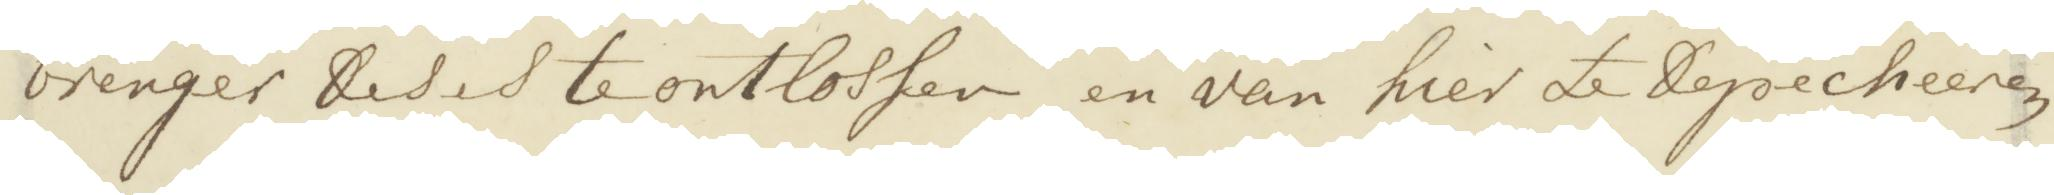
brenger deses te ontlossen en van hier te depecheeren
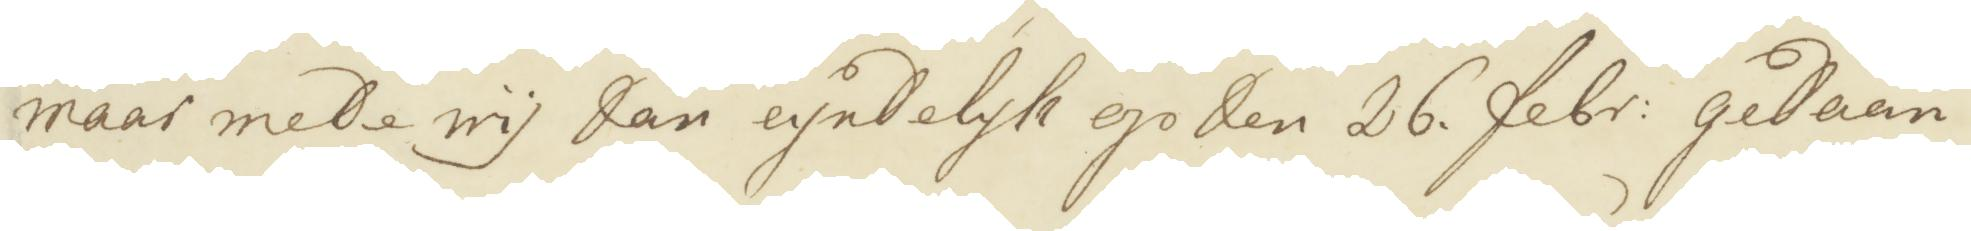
waar mede wij dan eyndelyk op den 26. febr: gedaan
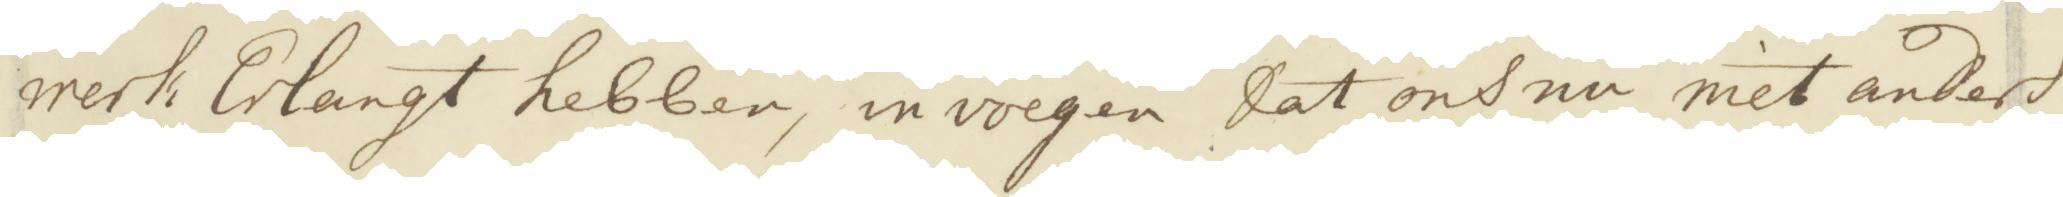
werk Erlangt hebben, in voegen dat ons nu niet anders
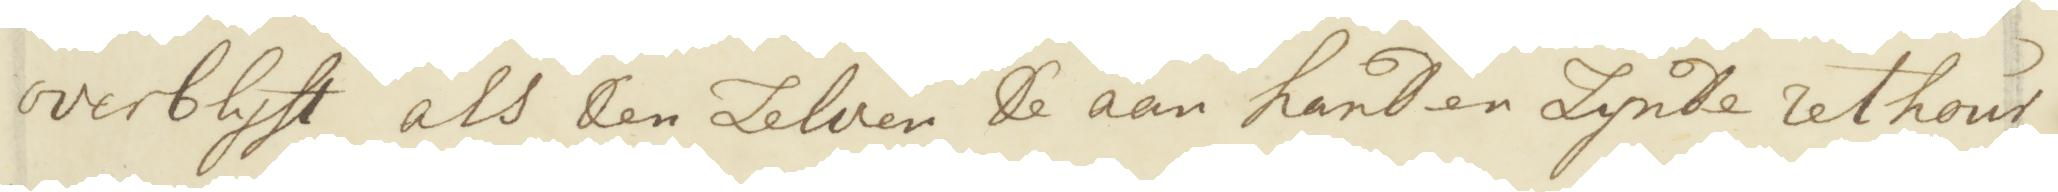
overblijft als den zelven de aan handen zynde rethour
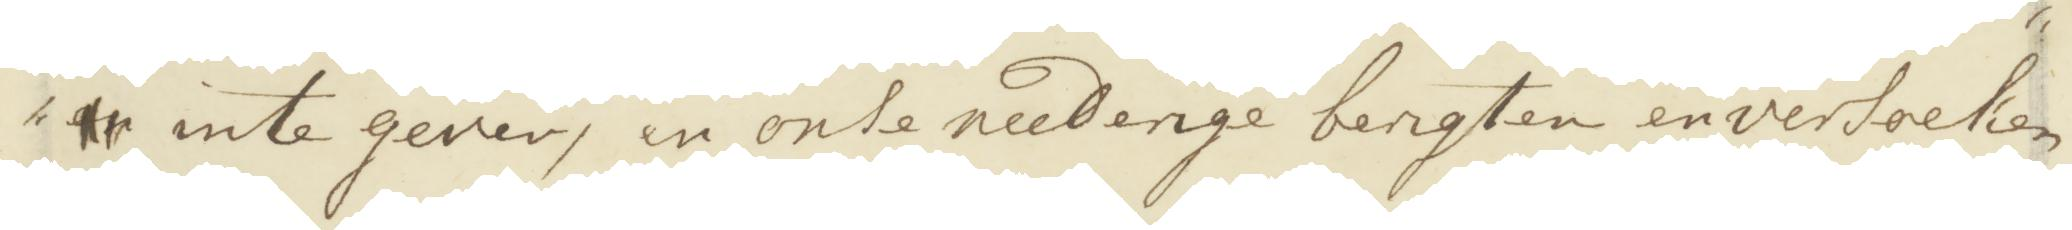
„en inte geven, in onse neederige berigten en versoeken
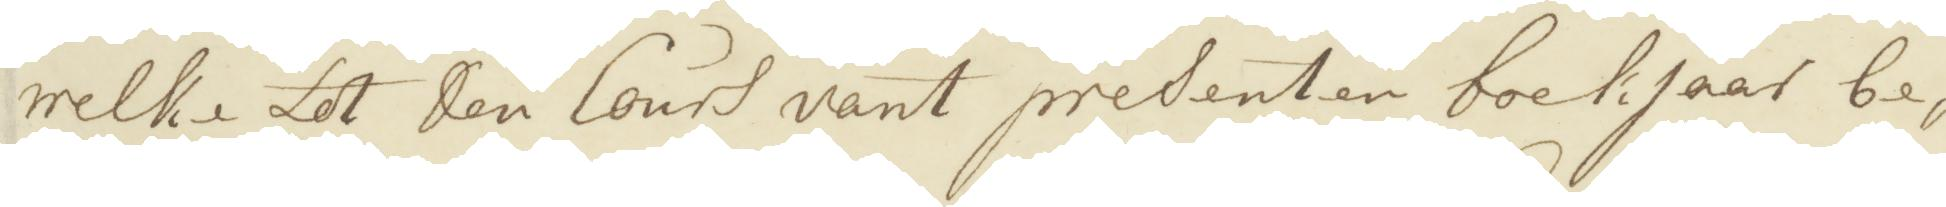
welke tot den Cours vant presenten boekjaar be
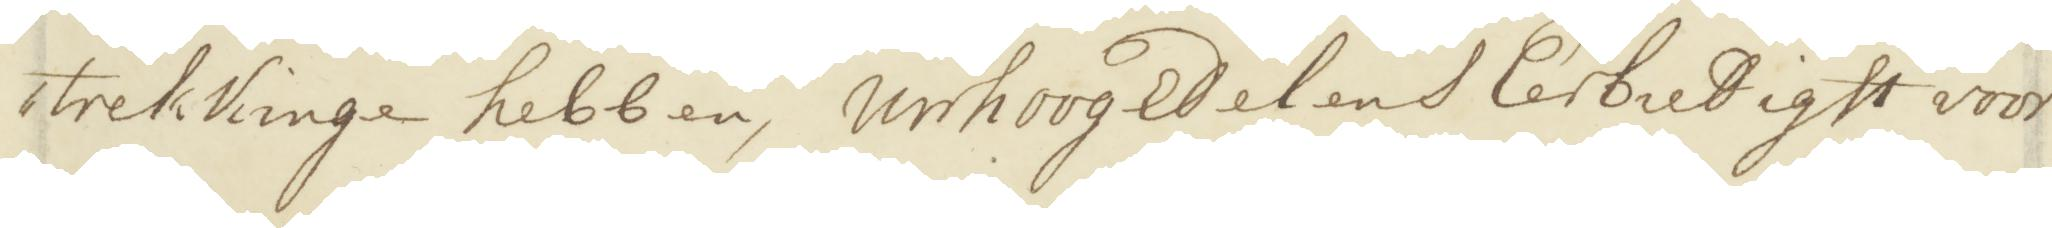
„trekkinge hebben, uw hoog Edelens Eerbiedigst voor
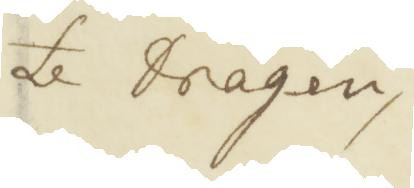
te dragen,
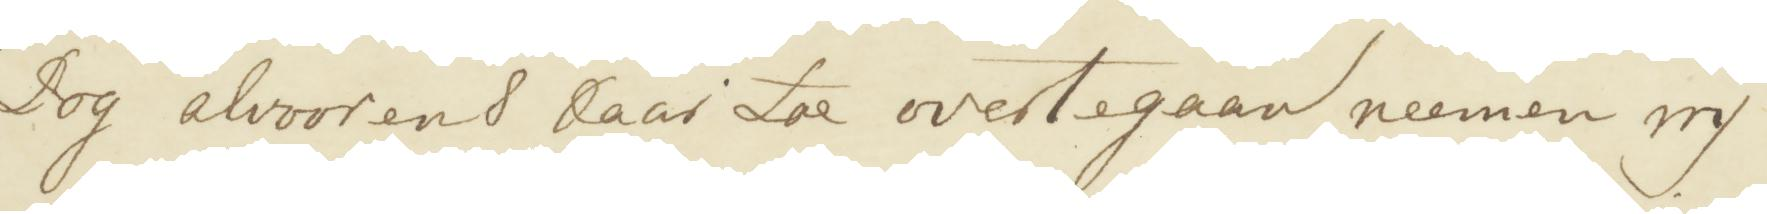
Dog alvoorens daar toe overtegaan neemen wij
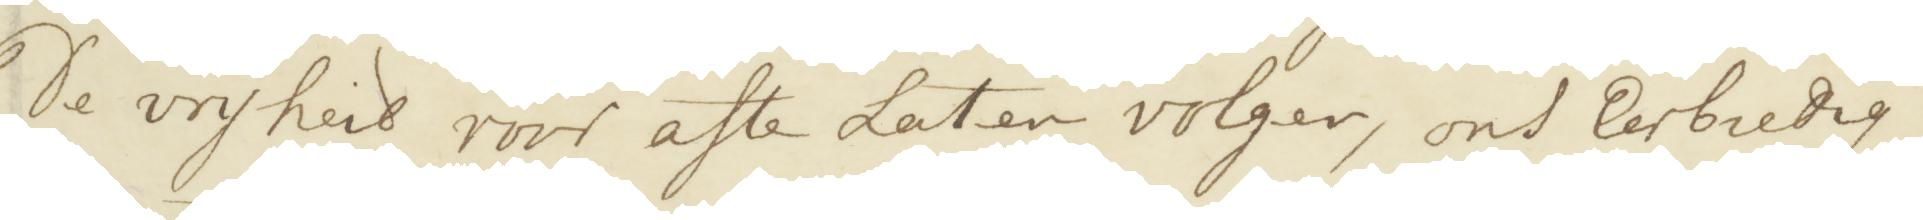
de vryheid voor afte laten volgen, ons Eerbiedig
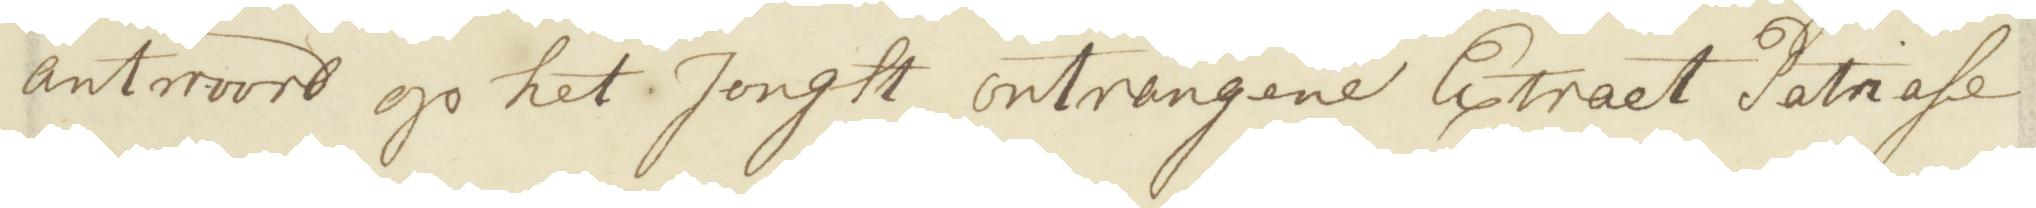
antwoord op het Jongst ontvangene Extract Patriase
